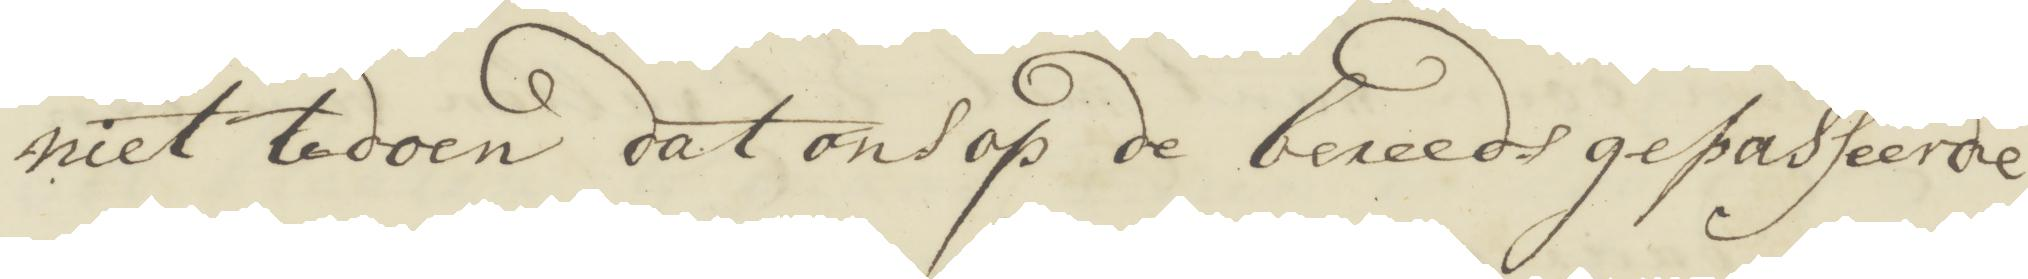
niet tedoen dat ons op de bereeds gepasseerde
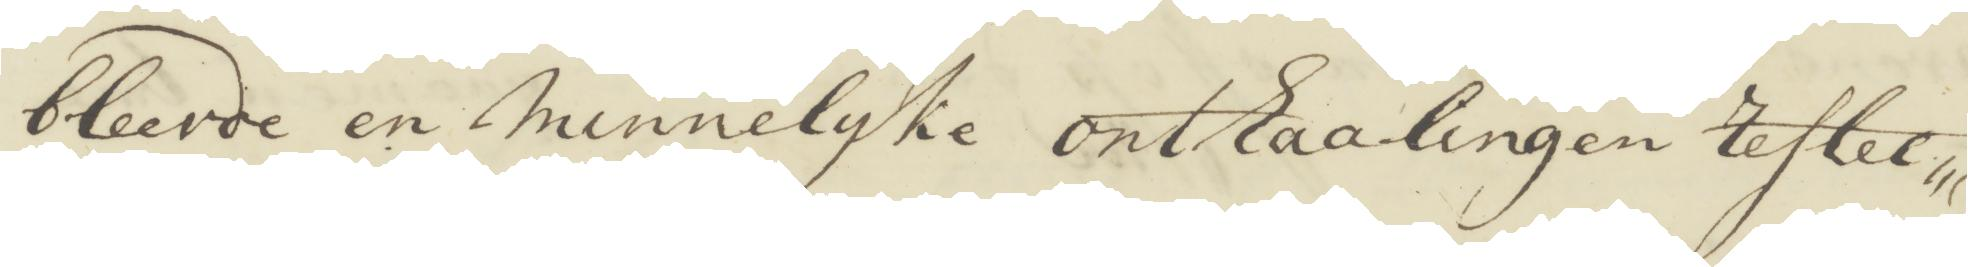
bleevde en minnelyke onthaalingen reflec„
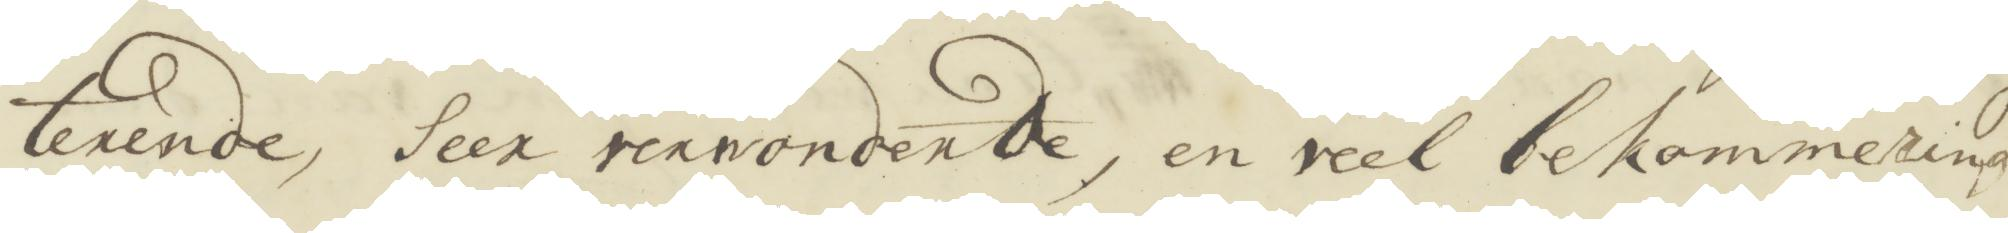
terende, seer verwonderde, en veel bekommerin
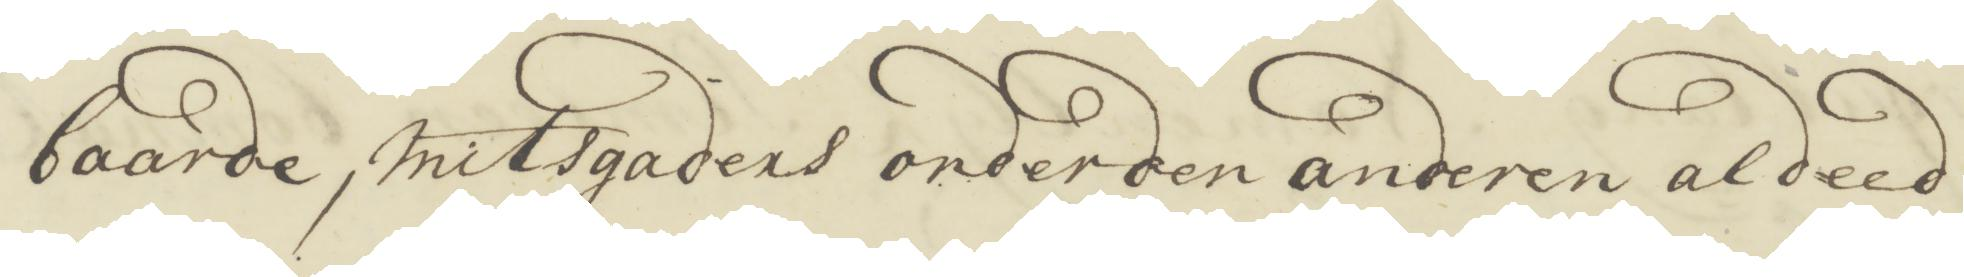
baarde, mitgaders onder den anderen al deed
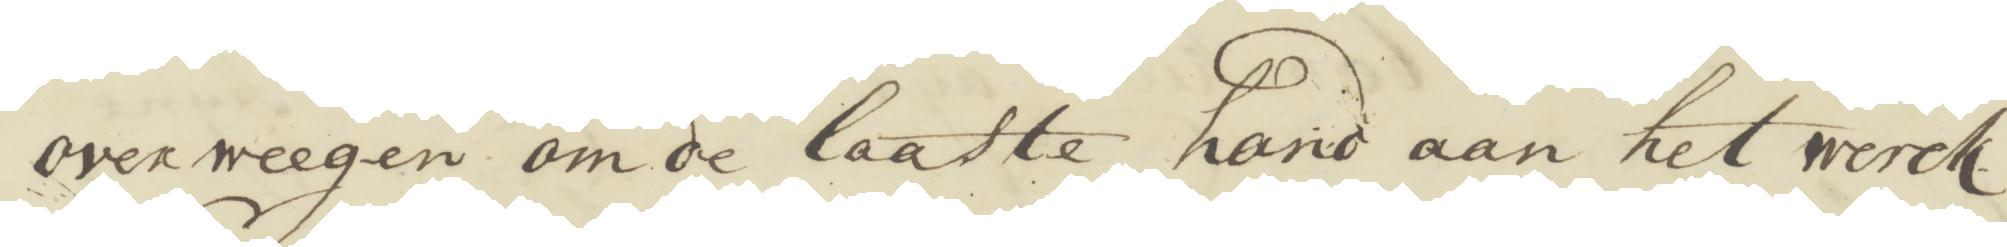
overweegen om de laaste hand aan het werck
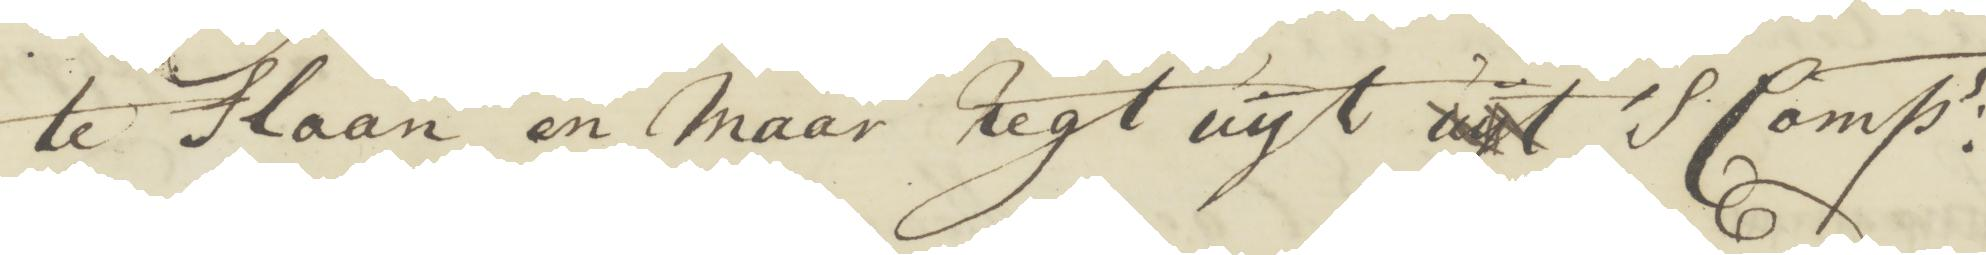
te slaan en maar zegt uijt uijt ’s Comp:s
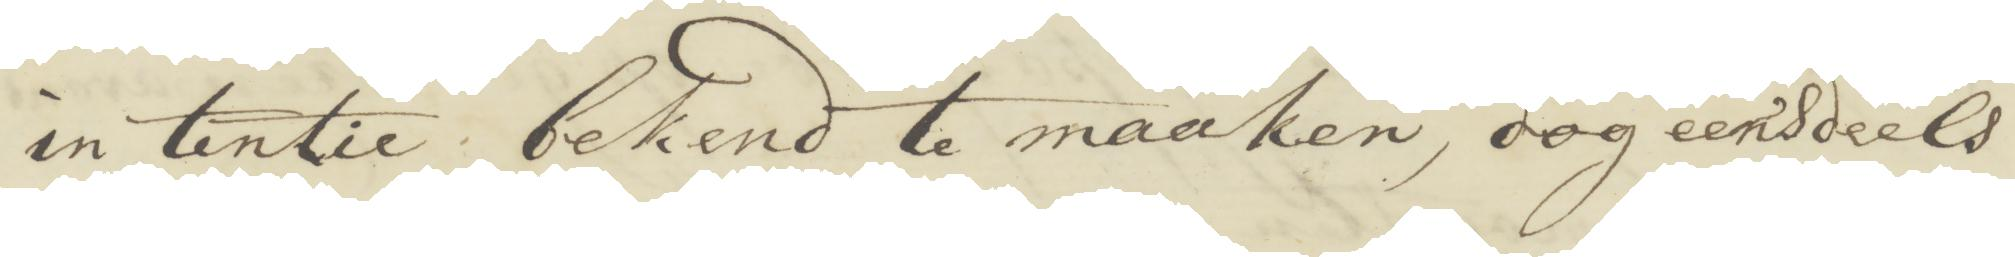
in tentie bekend te maaken, dog eensdeels
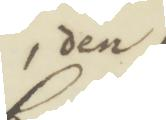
,den
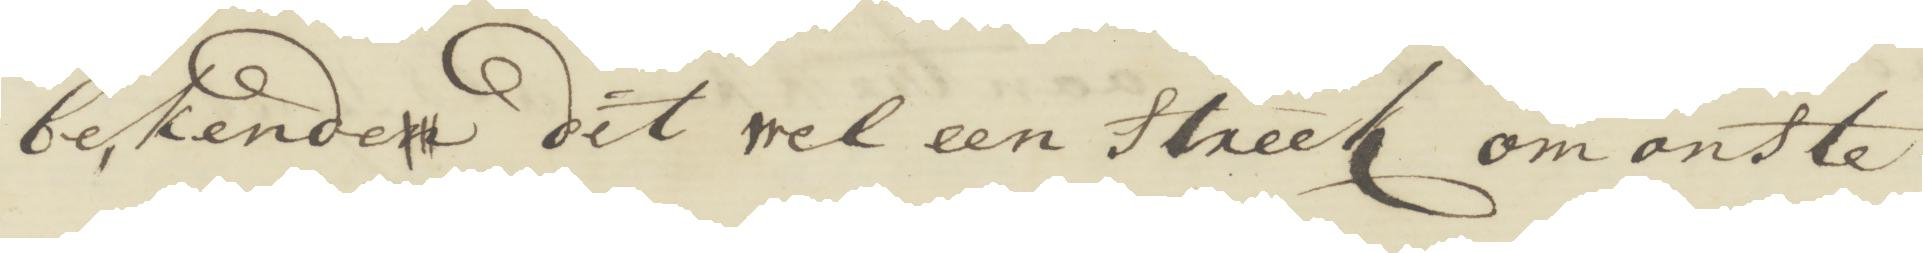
be,kenden dit wel een streek om onste
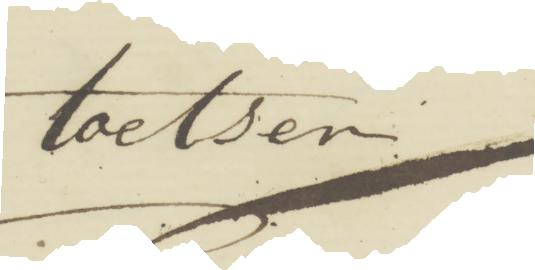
toetsen
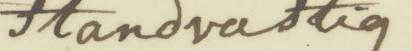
standvastig
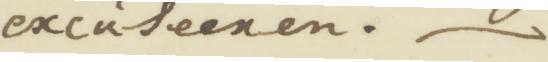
excuseeren. -
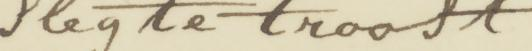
slegte troost
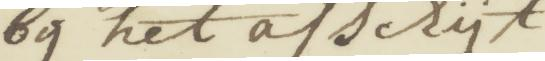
bij het afschijt
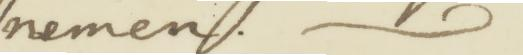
nemen. -
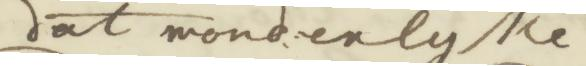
dat wonderlyke
